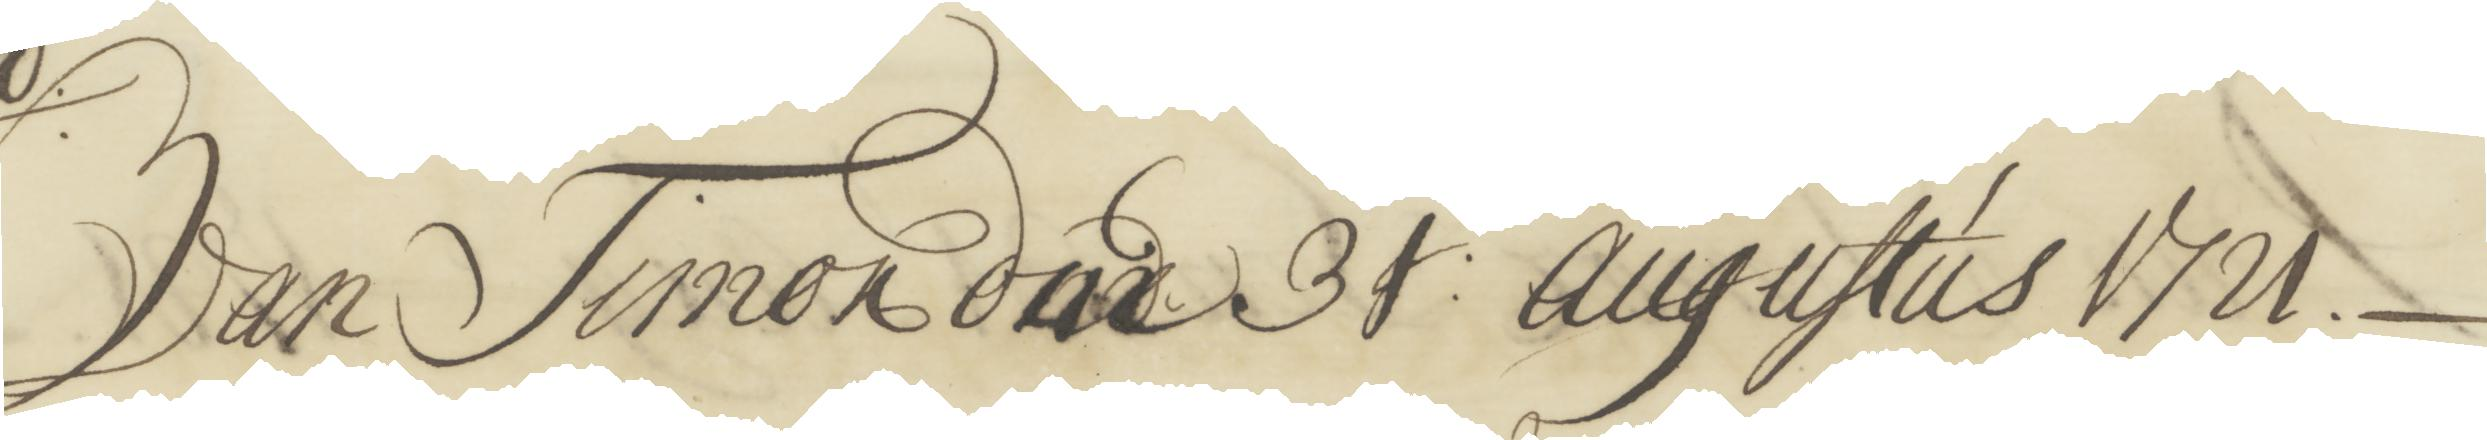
Van Timor den 31:' augustus 1721. —
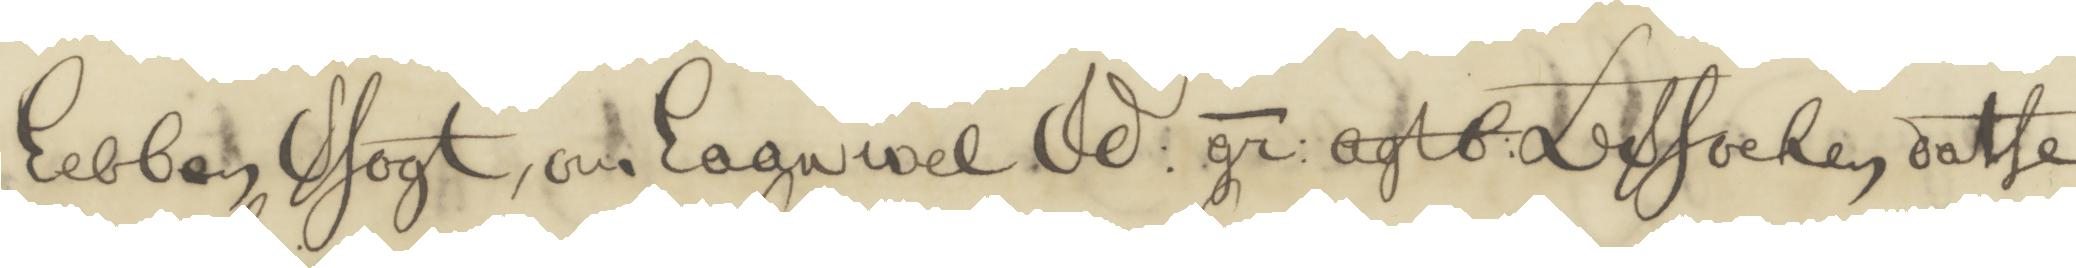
hebben versogt, om haar wel Ed: gr: agtb: te versoeken datse
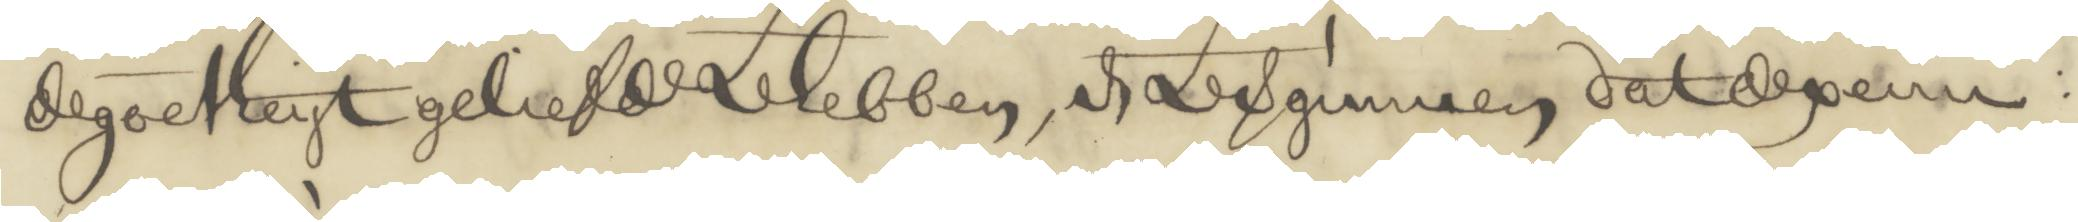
de goetheijt geliefde te hebben, en te vergunnen dat de penn:
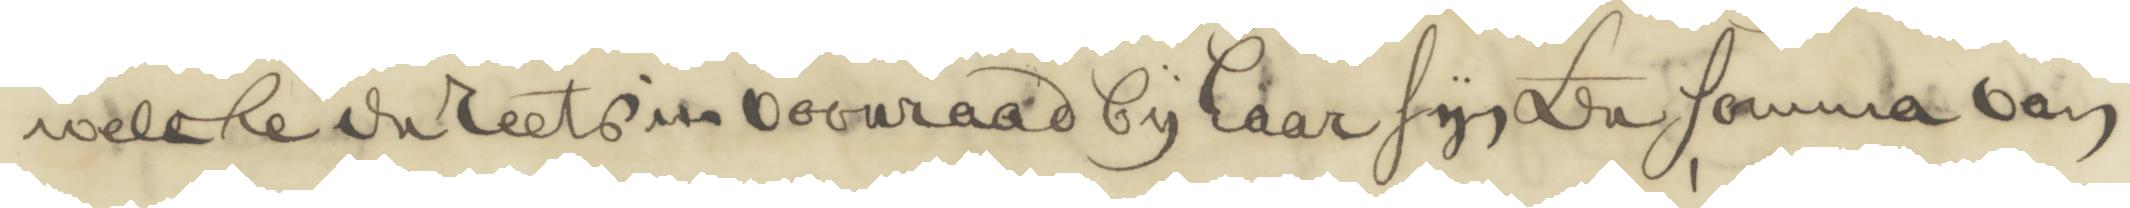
welcke 'er reets in voorraad bij haar sijn ter somma van
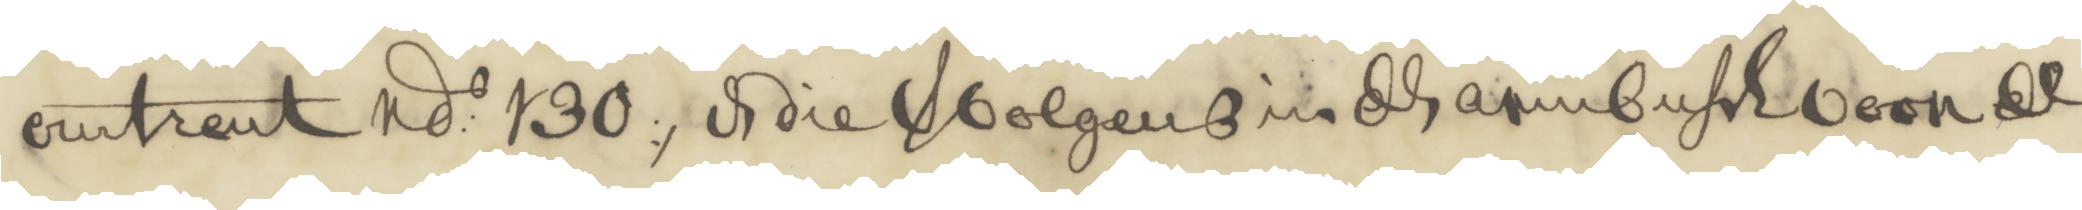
omtrent rd:s 130:, en die vervolgens in den armbusch voor de
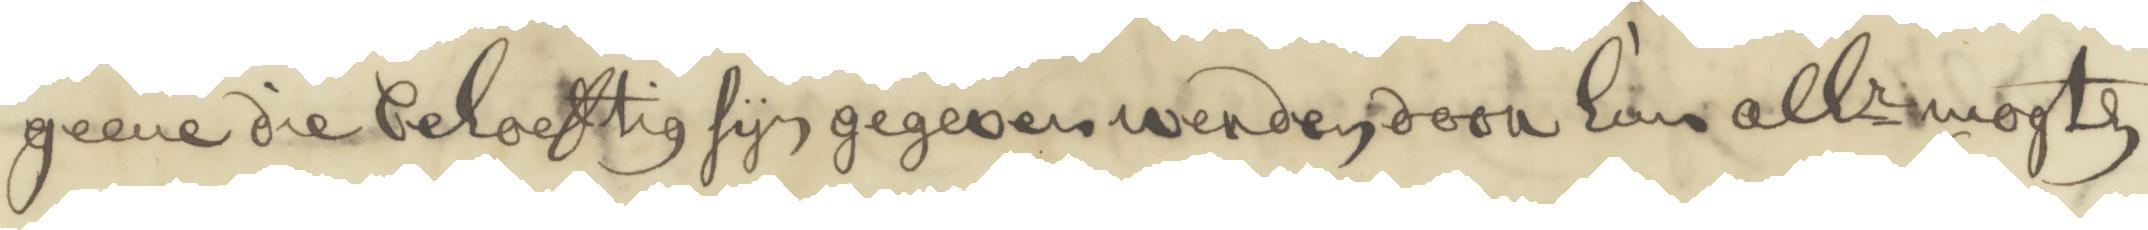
geene die behoeftig sijn gegeven werden door hun alh=r mogten
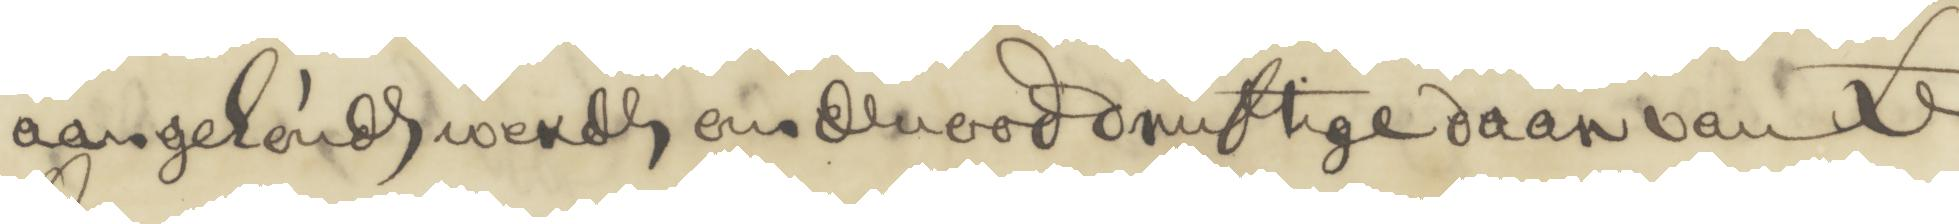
aan gehouden werden om de nood druftige daar van te
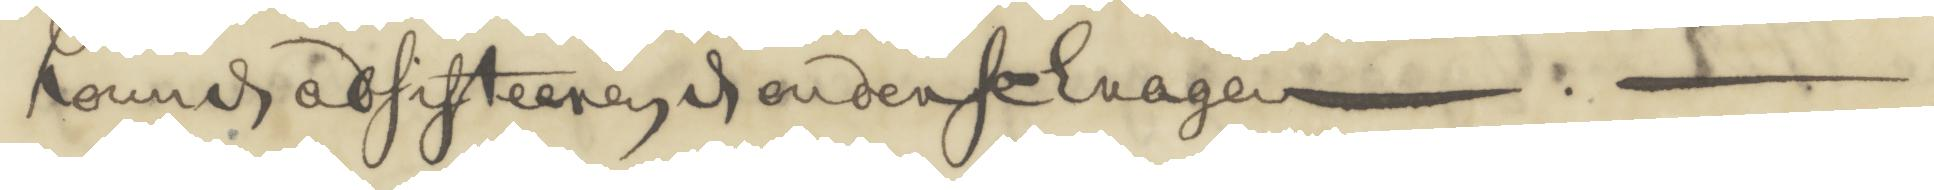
konnen adsisteeren en onder schragen. —
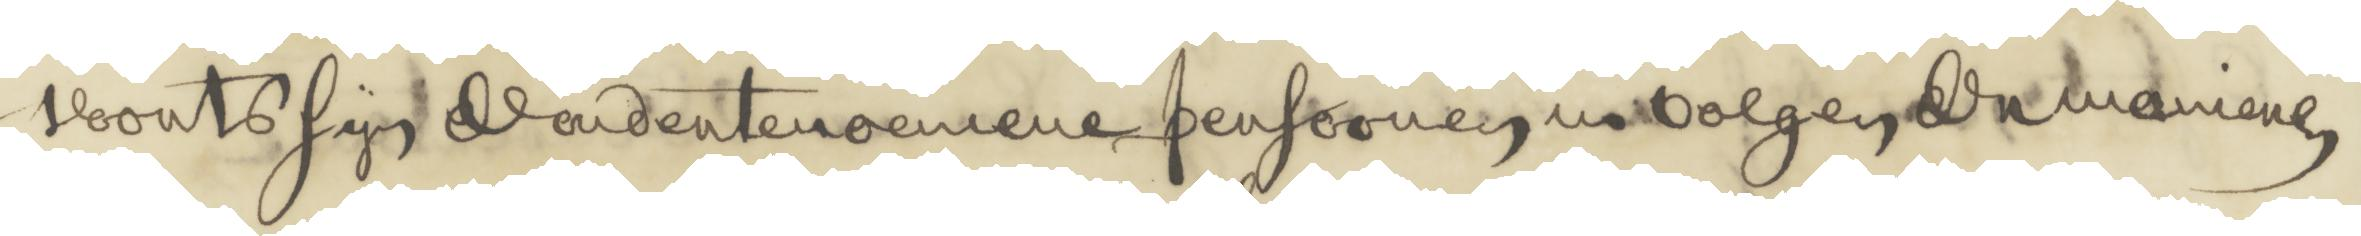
voorts sijn de ondertenoemene persoonen in volgen der manieren
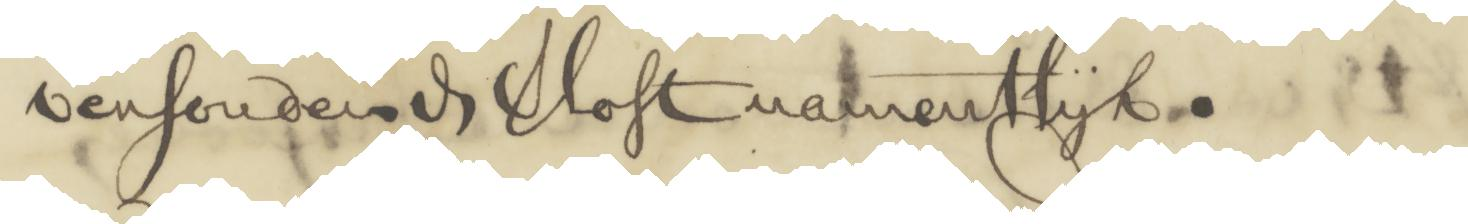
versonden en verlost namentlijk.
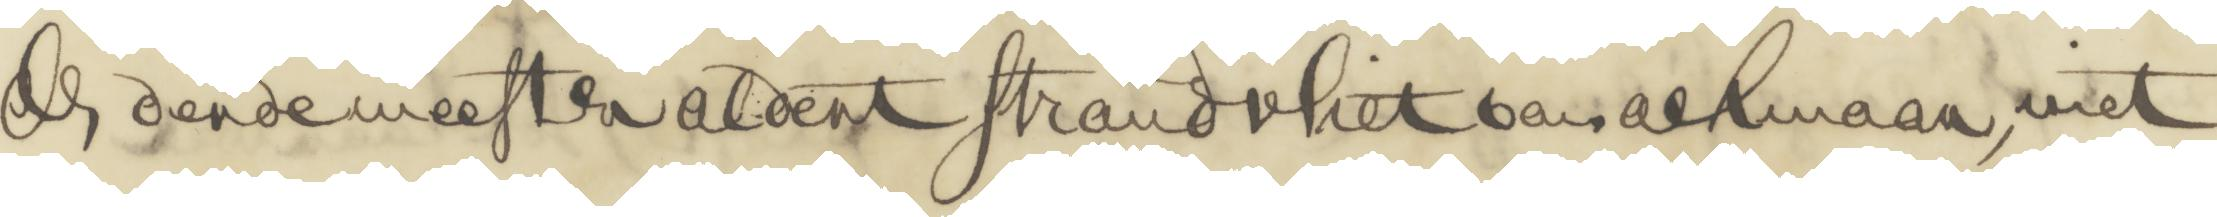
den derde meester aldert strandvliet van alkmaar, niet
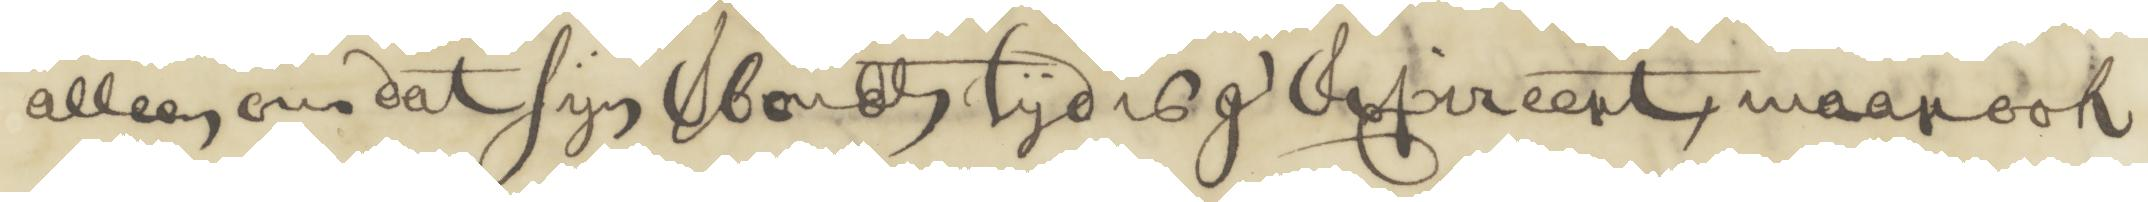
alleen om dat sijn verbonden tijd is g’ Expireert, maar ook
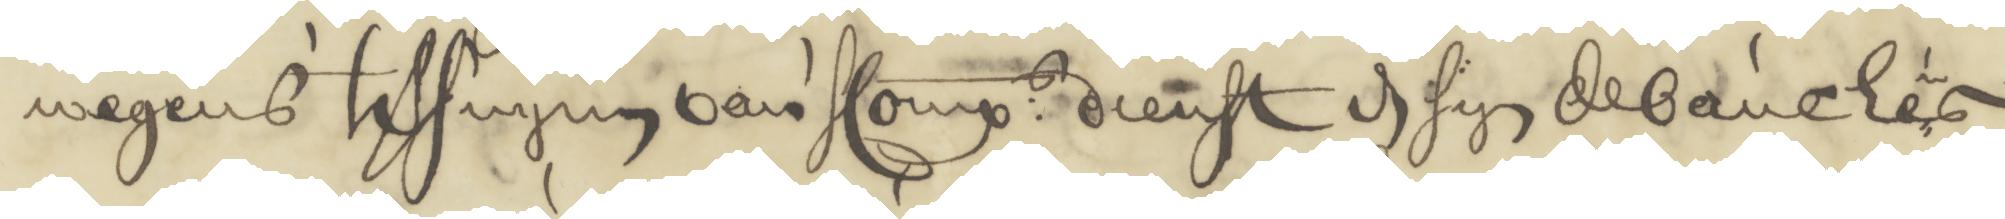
wegens 't versuijm van 'sComp:s dienst en sijn de bauche„s
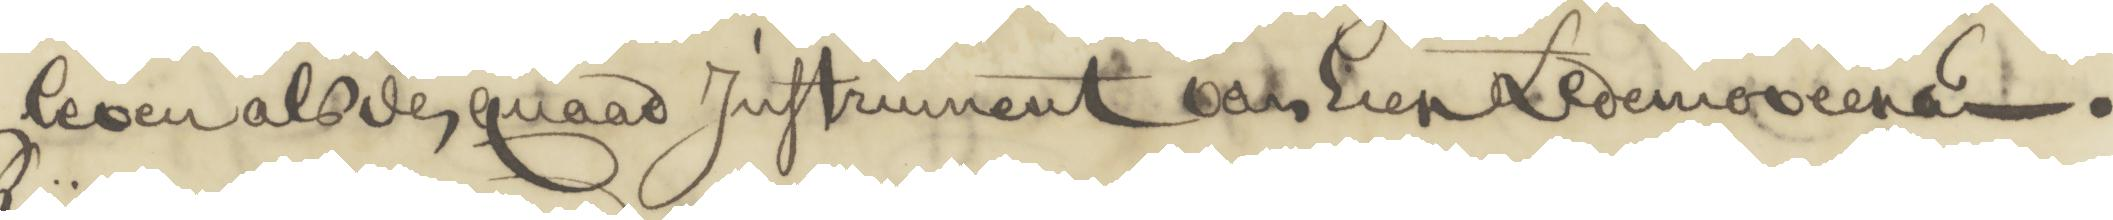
leven als een quaad Justrument van hier te demoveeren.
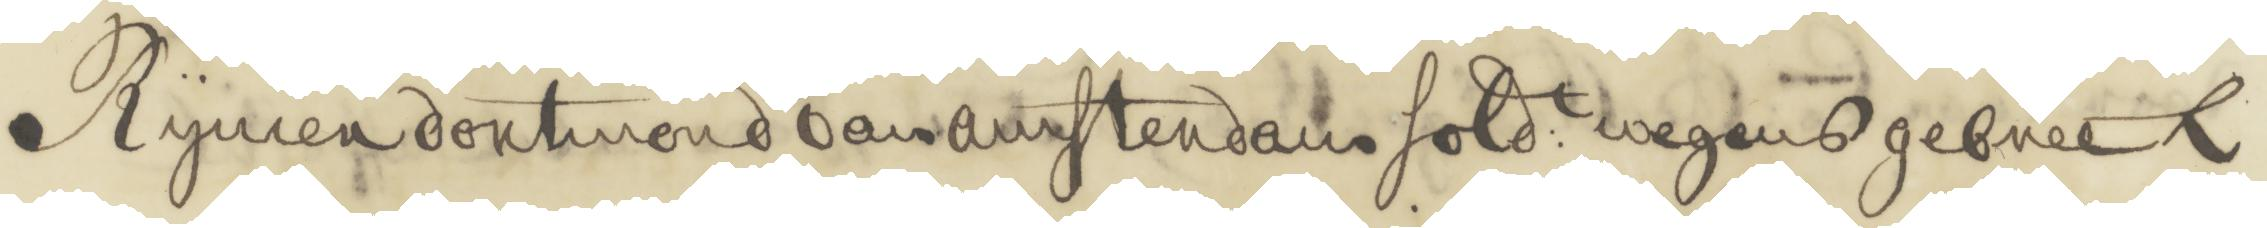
Rijnier dortmond van amsterdam sold:t wegens gebreck
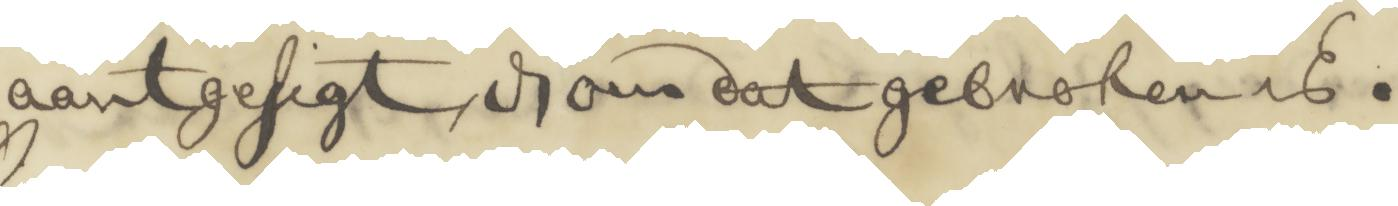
aan't gesigt, en om dat gebroken is.
